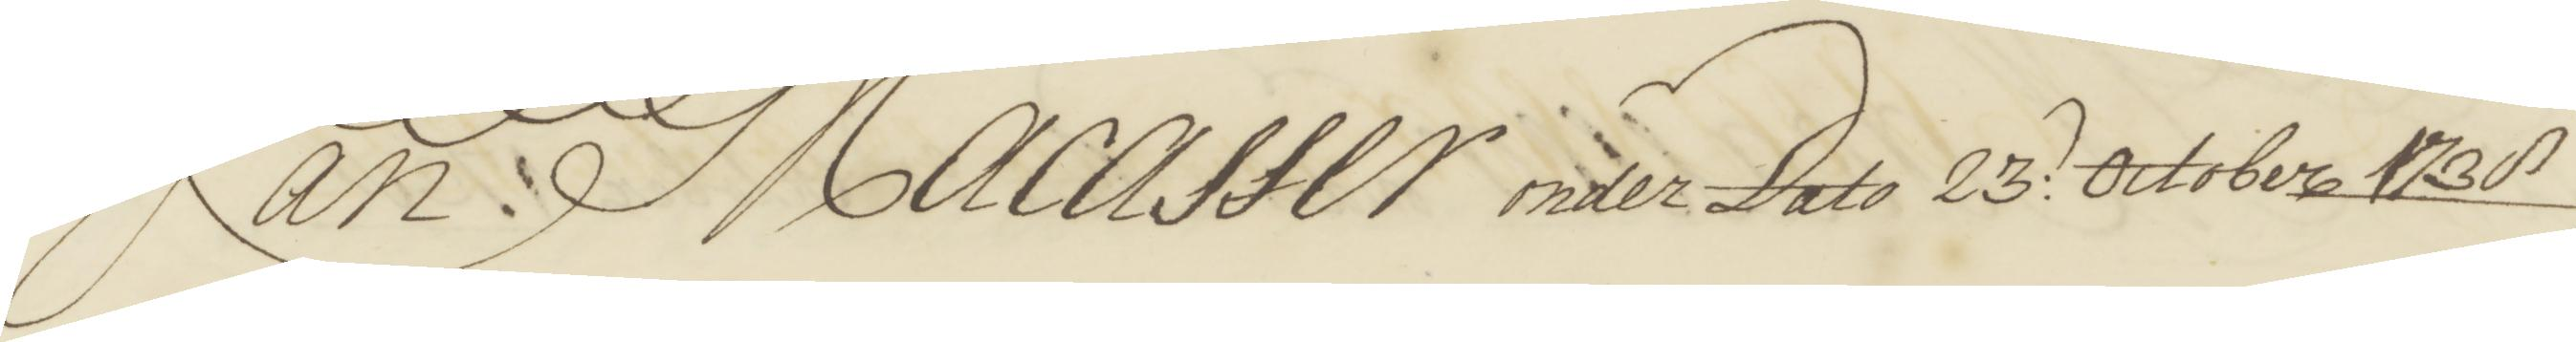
Van Macasser onder Dato 23:' october 1738
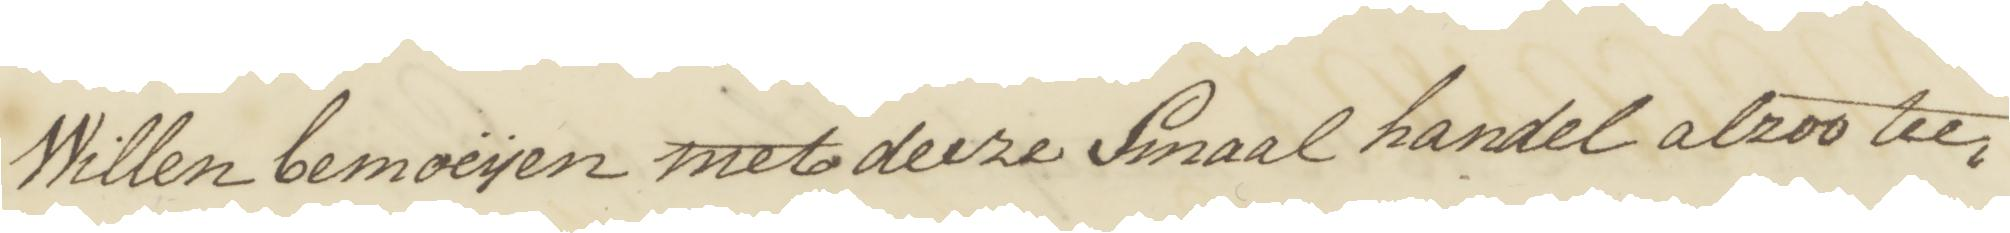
Willen bemoeijen met deeze Smaal handel alzoo tee„
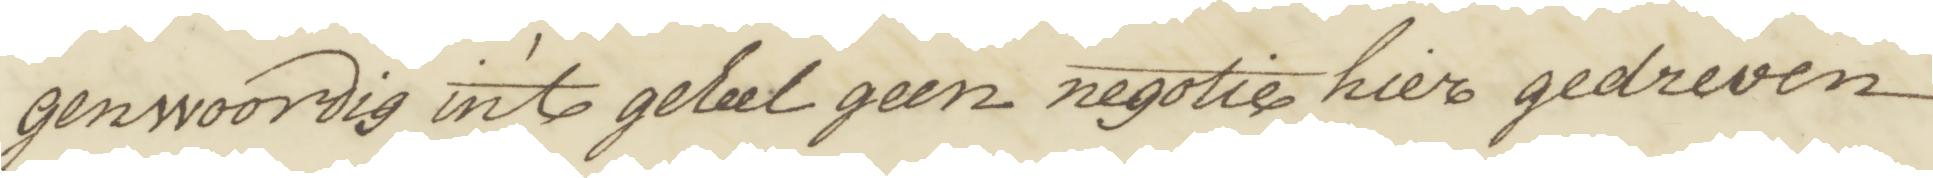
genwoordig in't geheel geen negotie hier gedreven
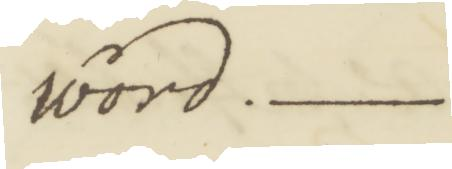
word. —
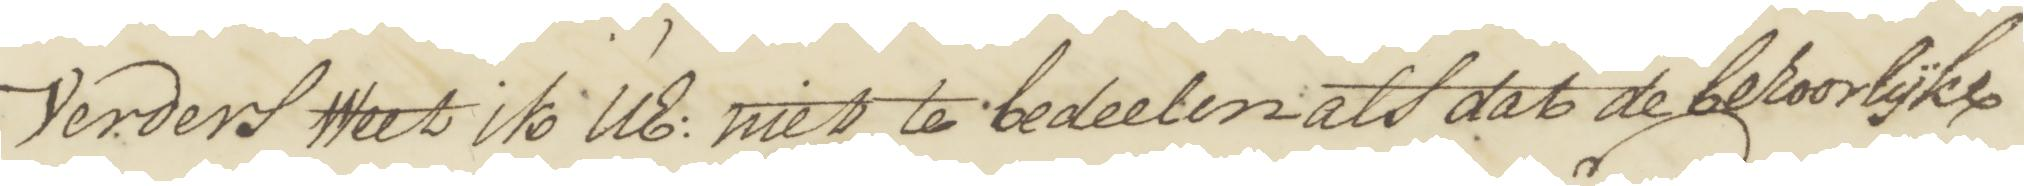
Verders weet ik UE: niet te bedeelen als dat de behoorlijke
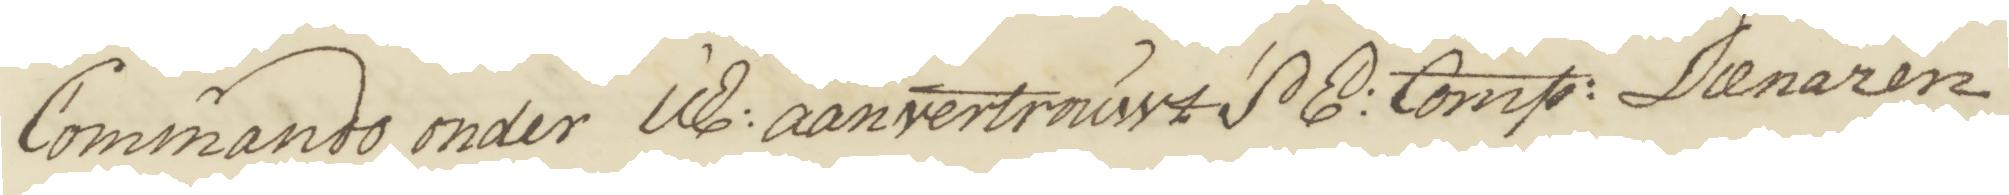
Commando, onder UE: aanvertrouwt 'S E: Comp: Dienaren
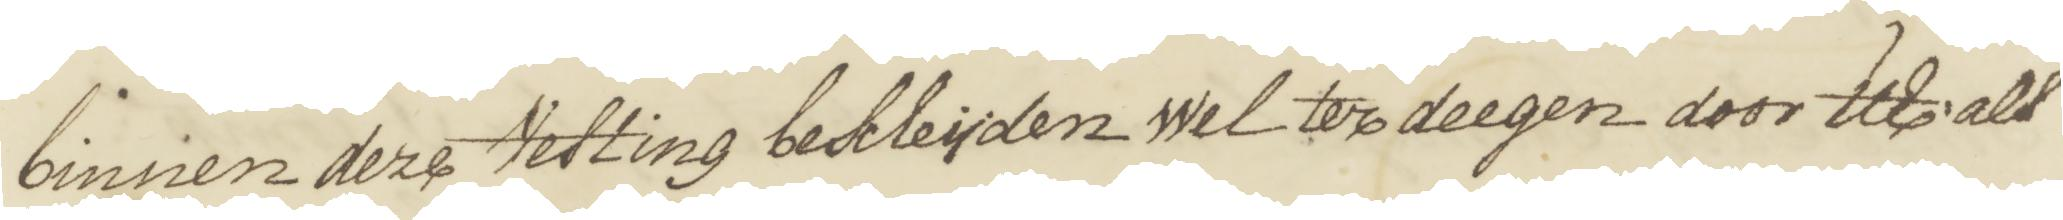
binnen deze vesting bescheijden wel ter deegen door UE. als
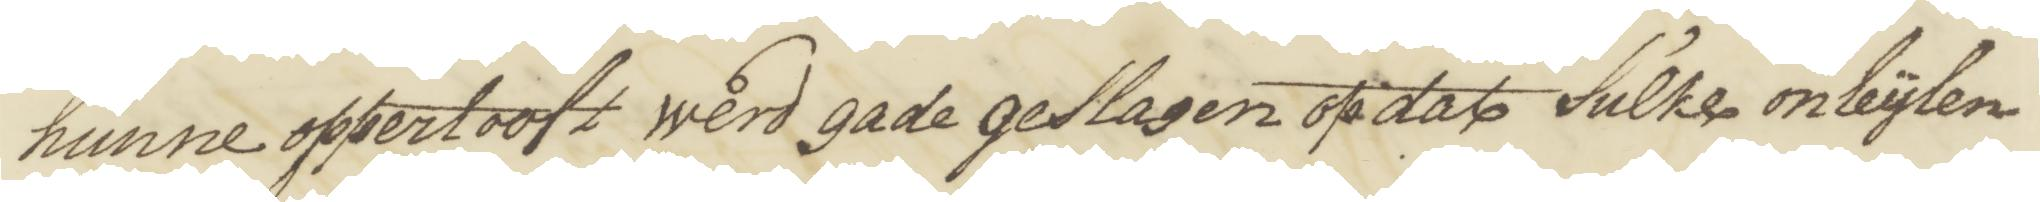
hunne opperhooft werd gade geslagen op dat sulke onheijlen
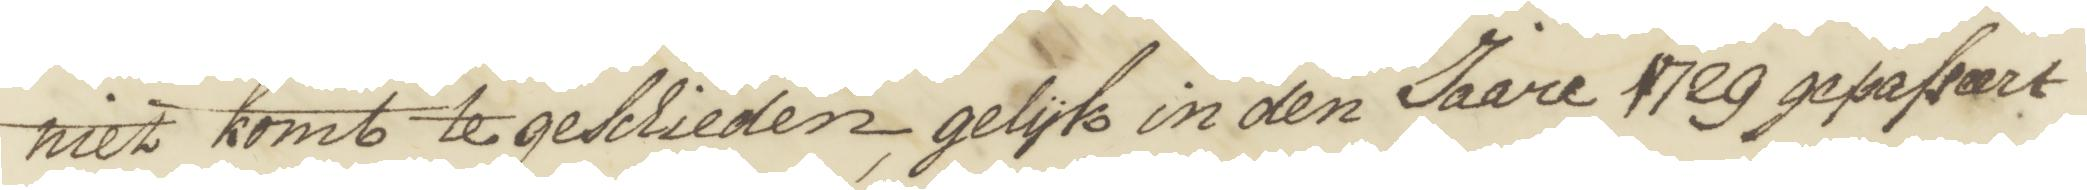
niet komt te geschieden, gelijk in den Jaare 1729 gepasseert
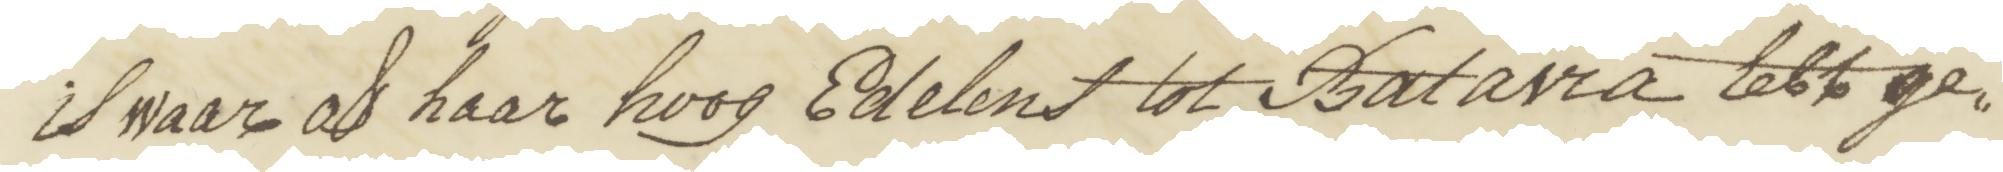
is waar over haar hoog Edelens tot Batavia hebt ge„
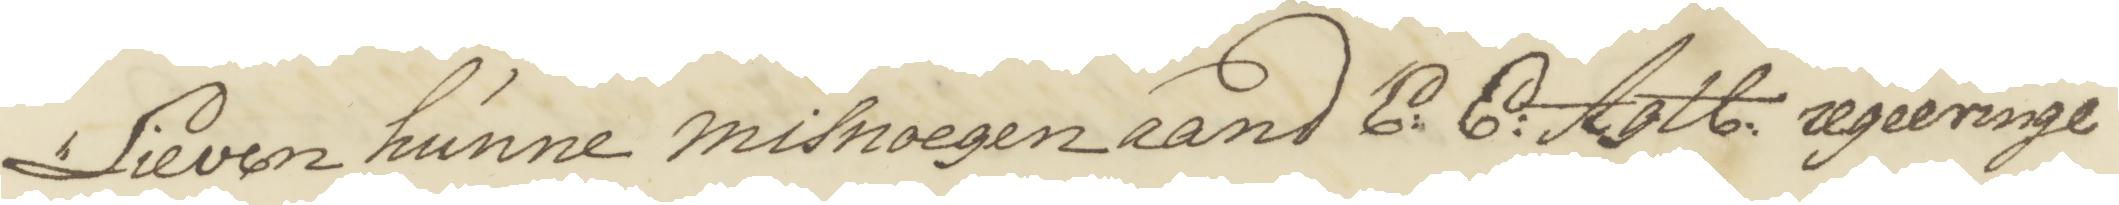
„lieven hunne misnoegen aan d' E: E: Agtb: regeeringe
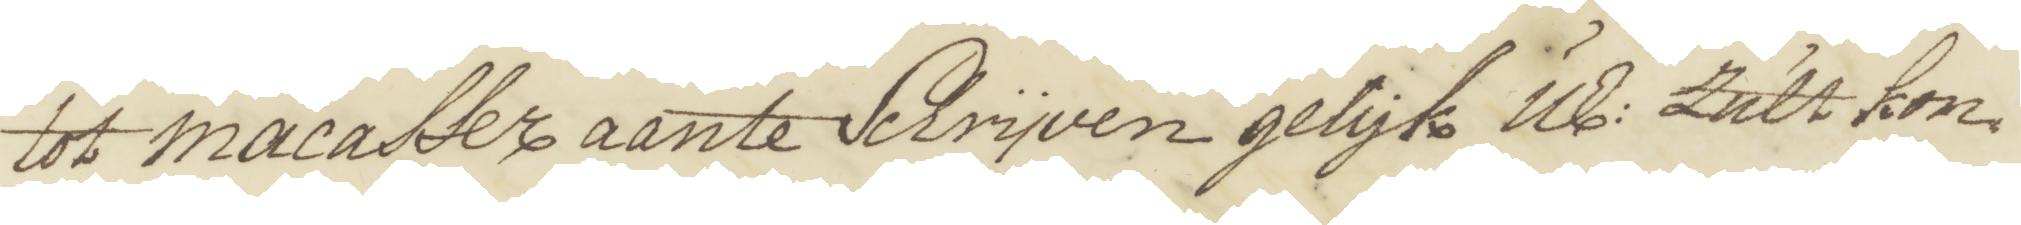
tot macasser aante schrijven gelijk UE: zult kon„
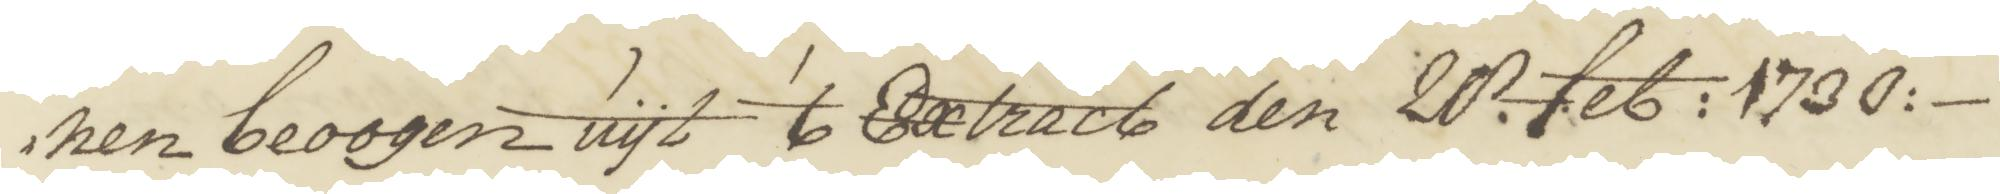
„nen beoogen uijt ’t Extract den 28. feb: 1730: —
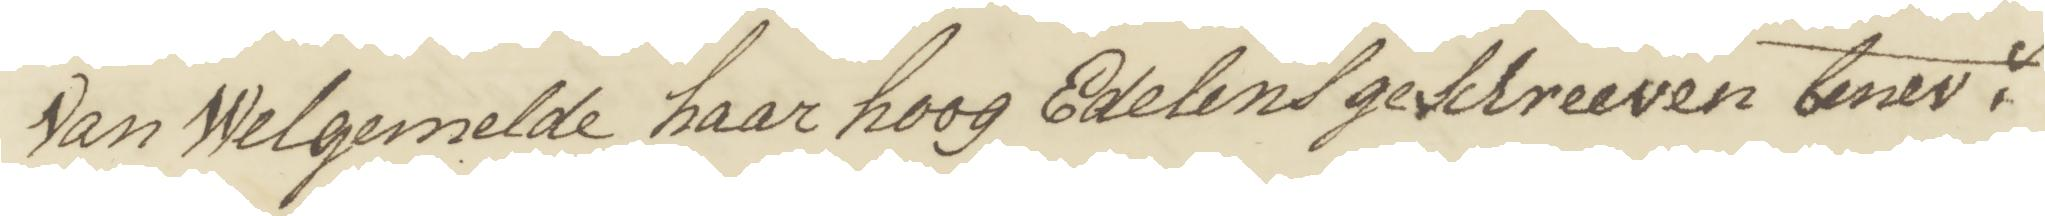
van welgemelde haar hoog Edelens geschreeven benev„s
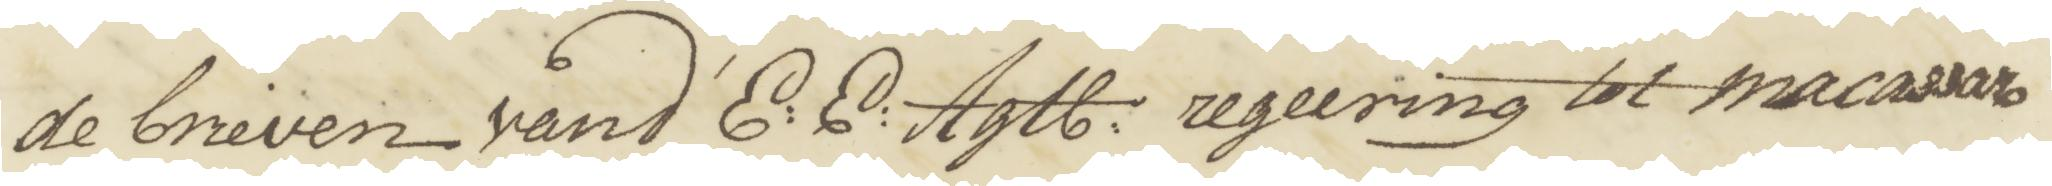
de brieven van d’ E: E: Agtb: regeering tot macassar
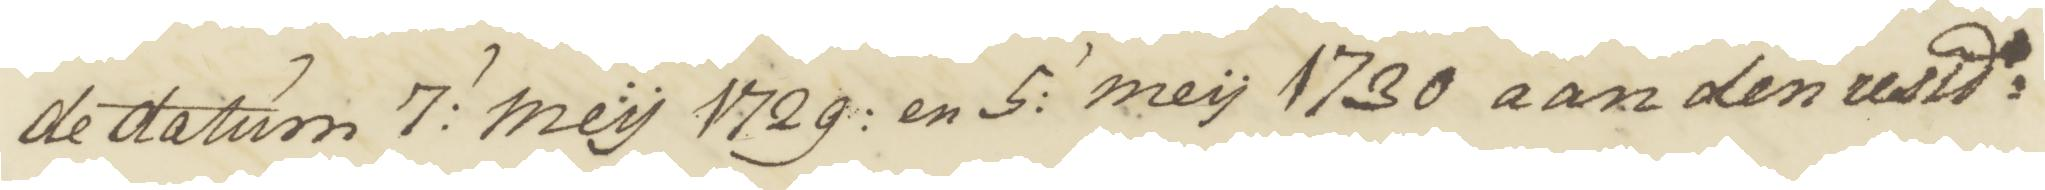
de datum 7:' meij 1729: en 5:' meij 1730 aan den resid:t
